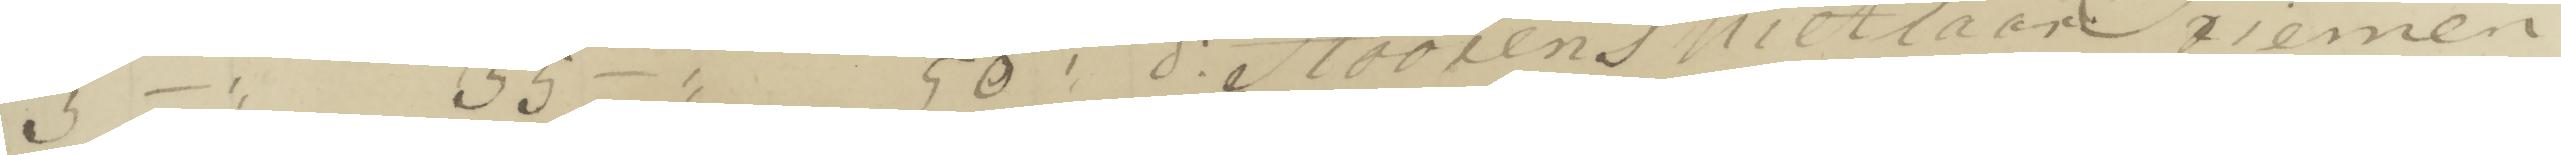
3 — „ 35 — „ 50 „ d:o Hoorens niet haar Priemen
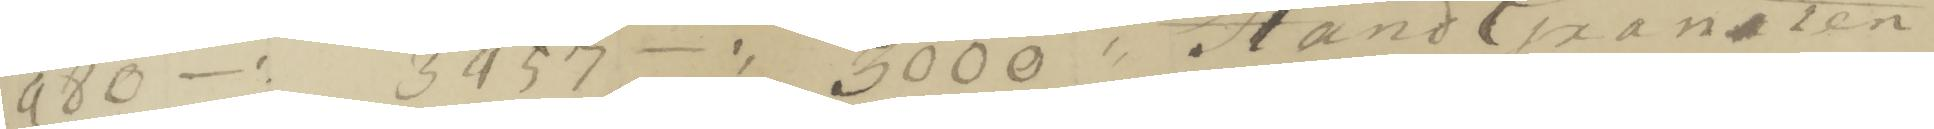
480 — „ 3457 — „ 3000 „ Hand Granaten
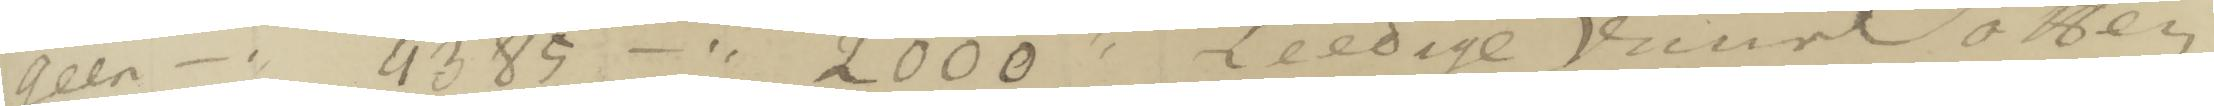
geen — „ 4385 — „ 2000 „ Leedige Vuur Potten
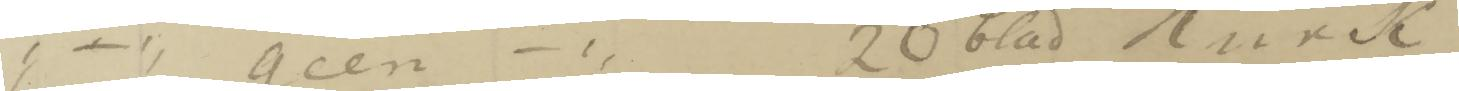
„ — „ geen — „ 20 blad Kurk
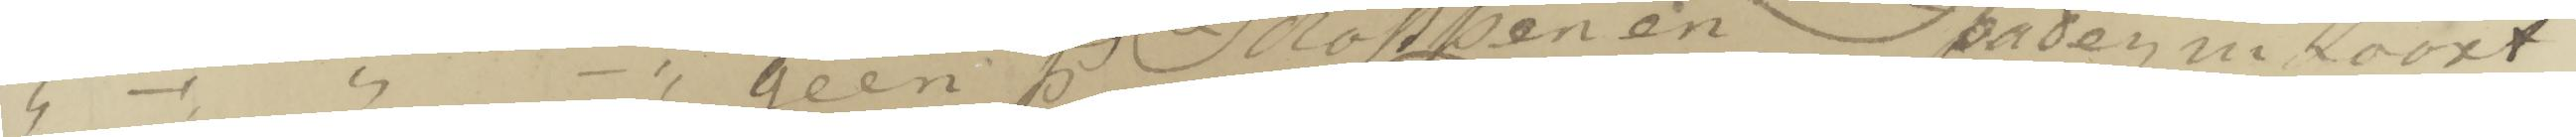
„ — „ „ — „ geen ps Schoppen en Spaden in zoort
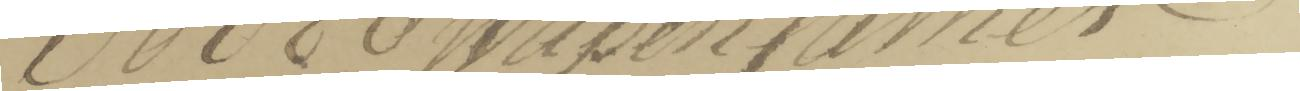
Voor d' wapen Camer
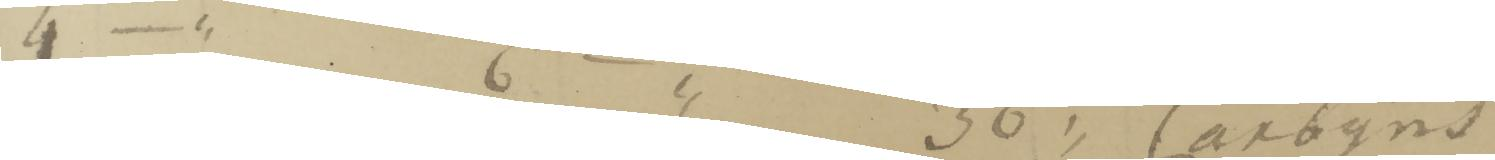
4 — „ 6 — „ 36 „ Carbijns
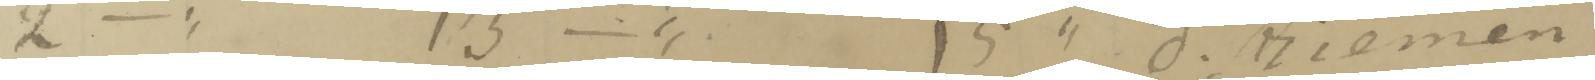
2 — „ 13 — „ 15 „ d:o riemen
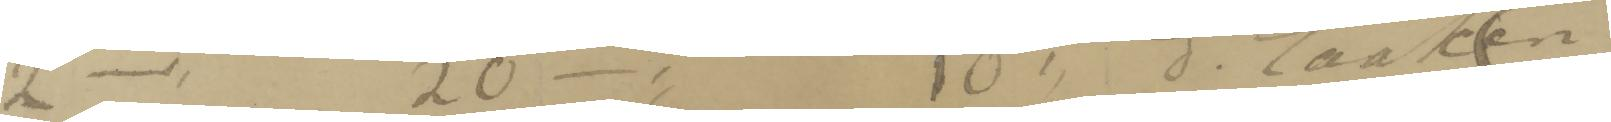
2 — „ 20 — „ 10 „ d:o haaken
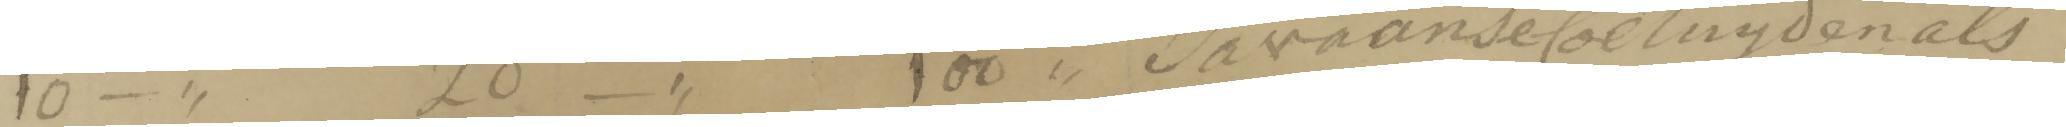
10 — „ 20 — „ 100 „ Iavaanse Coehuijden als
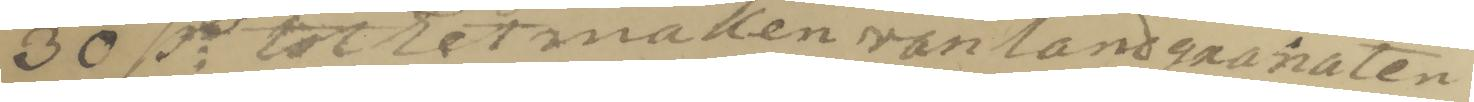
30 p:s tot het maken van hand granaten
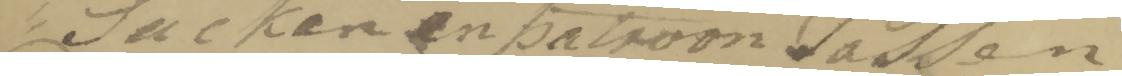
sacken en patroon Tassen
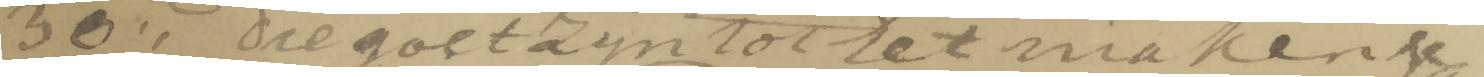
30 „ die goet zijn tot het maken van
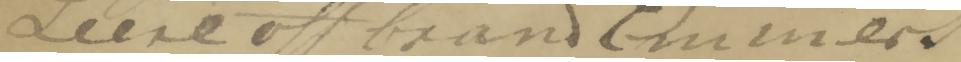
Leere off brand Emmers
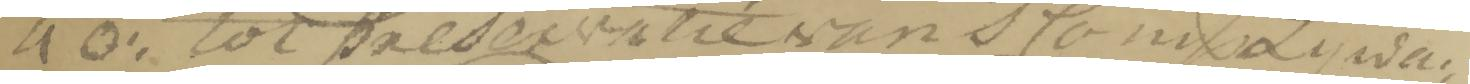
40 „ tot preservatie van ’s Comp Lijwa„
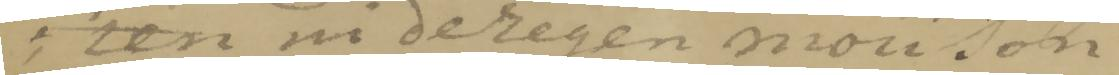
„ten in deregen mouson
